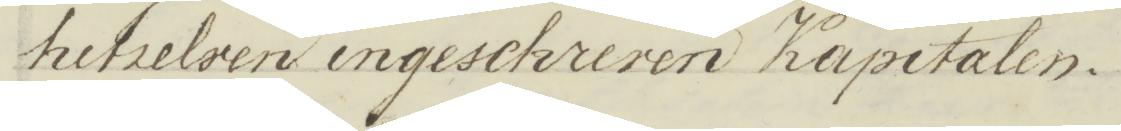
hetzelven ingeschreven Kapitalen.
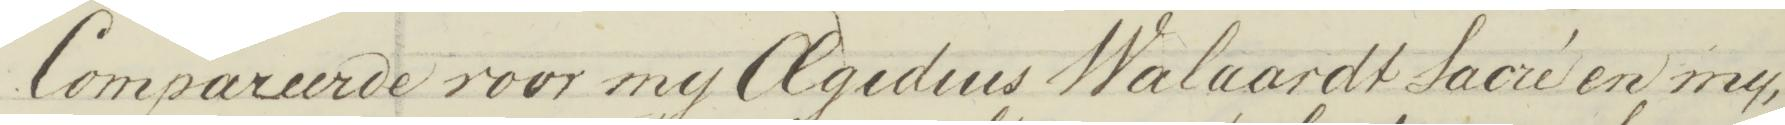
Compareerde voor my AEgidius Walaardt Sacré en my,
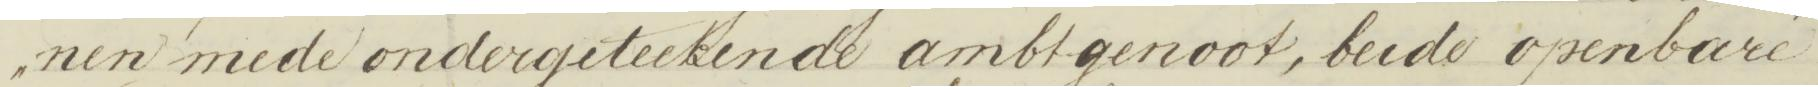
„nen mede ondergeteekende, ambtgenoot, beide openbare
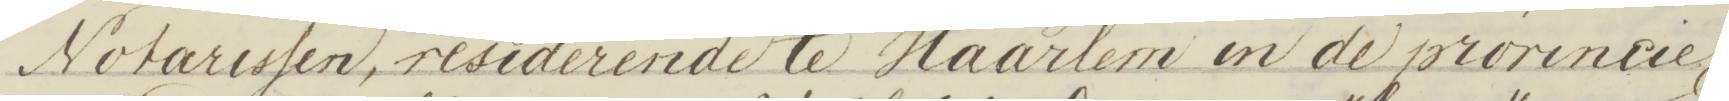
Notarissen, residerende te Haarlem in de provincie
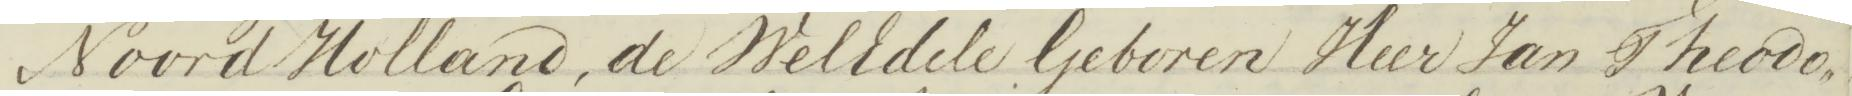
Noord Holland, de WelEdele Geboren Heer Jan Theodo„
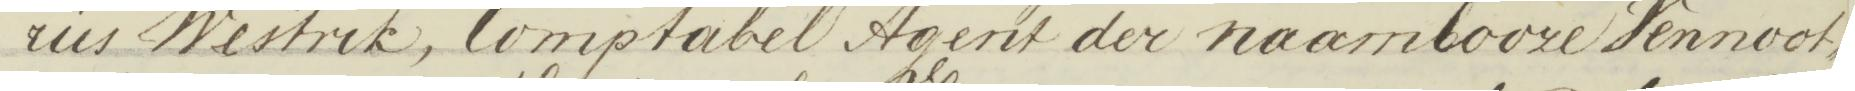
rus Westrik, Comptabel Agent der naamlooze Vennoot„
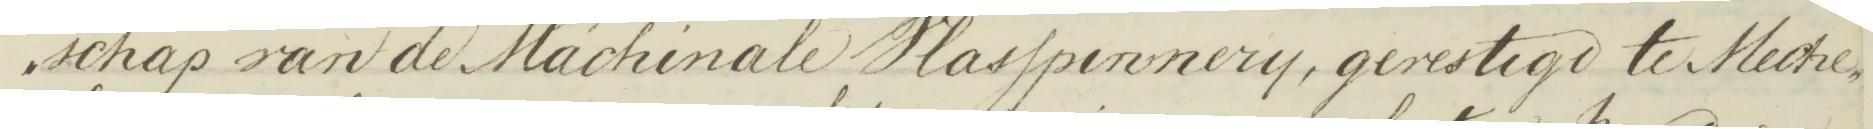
„schap van de Machinale Vlasspinnery, gevestigd te Meche„
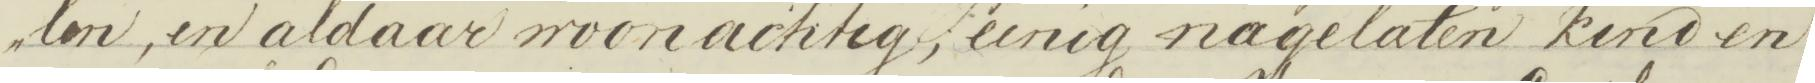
„len, en aldaar woonachtig, eenig nagelaten kind en
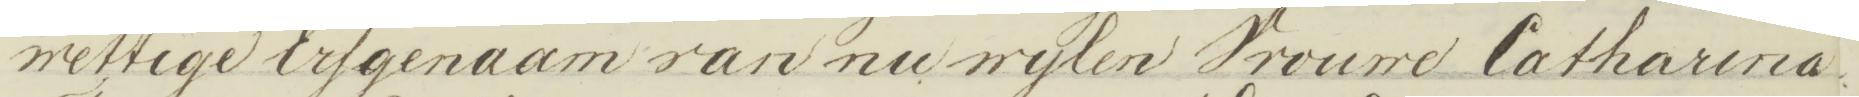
wettige Erfgenaam van nu wylen Vrouwe Catharina
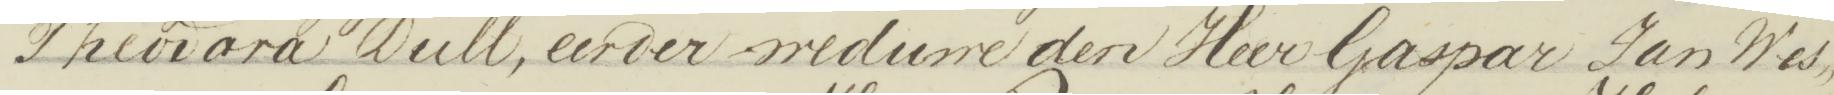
Theodora Dull, eerder weduwe den Heer Gaspar Ian Wes„
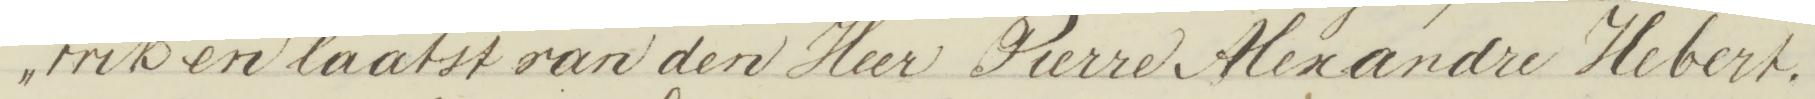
„trik en laatst van den Heer Pierre Alexandre Hebert.
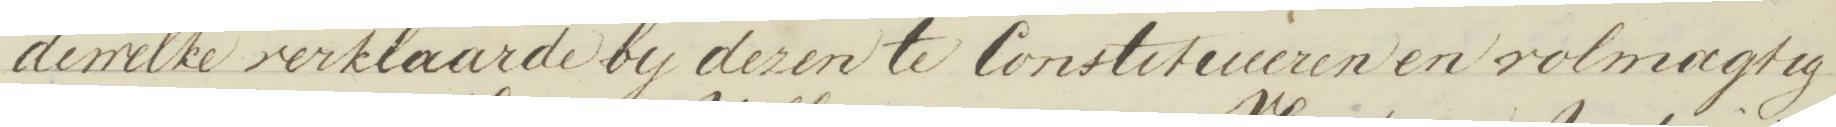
dewelke verklaarde by dezen te Constitueeren en volmagtig
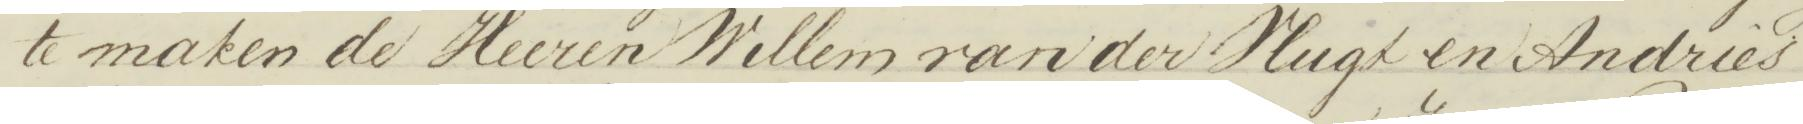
te maken de Heeren Willem van der Vlugt en Andries
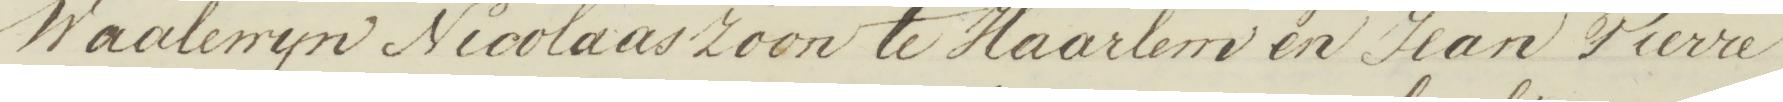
Waalewyn Nicolaaszoon te Haarlem en Jean Pierre
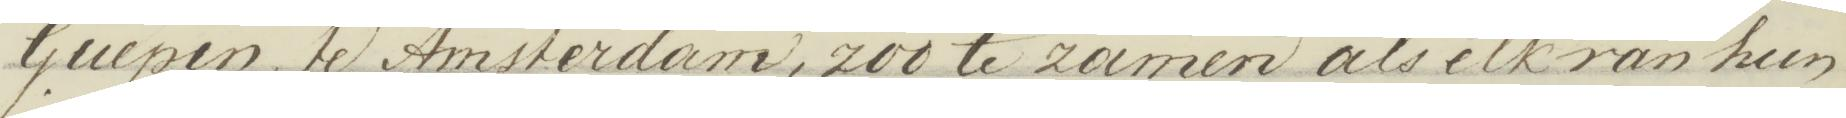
Guepen, te Amsterdam, zoo te zamen als elk van hun
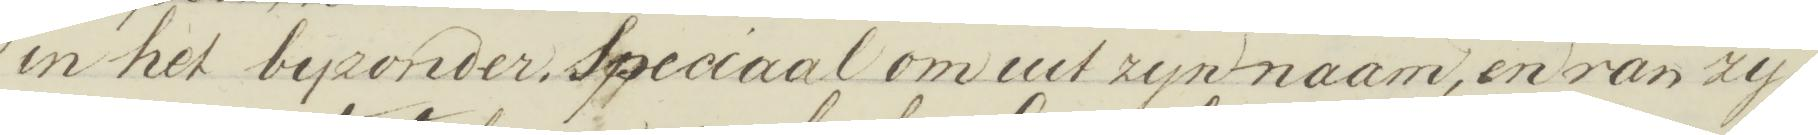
in het byzonder, speciaal om uit zyn naam, en van zy
